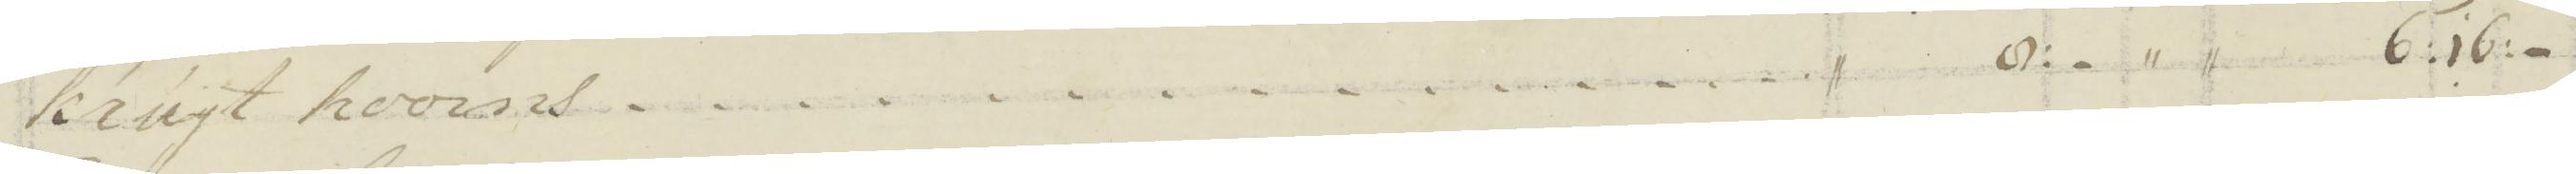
kruijt hoorns - - - - - - - - - - - - - - - - „ 8: - „ „ 6:16: -
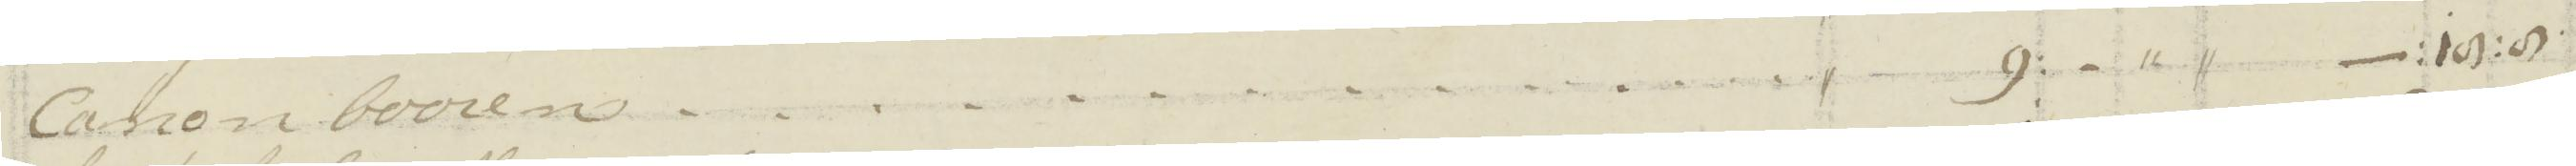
Canon booren - - - - - - - - - - - - - - - „ 9: -„ „ —:18:8
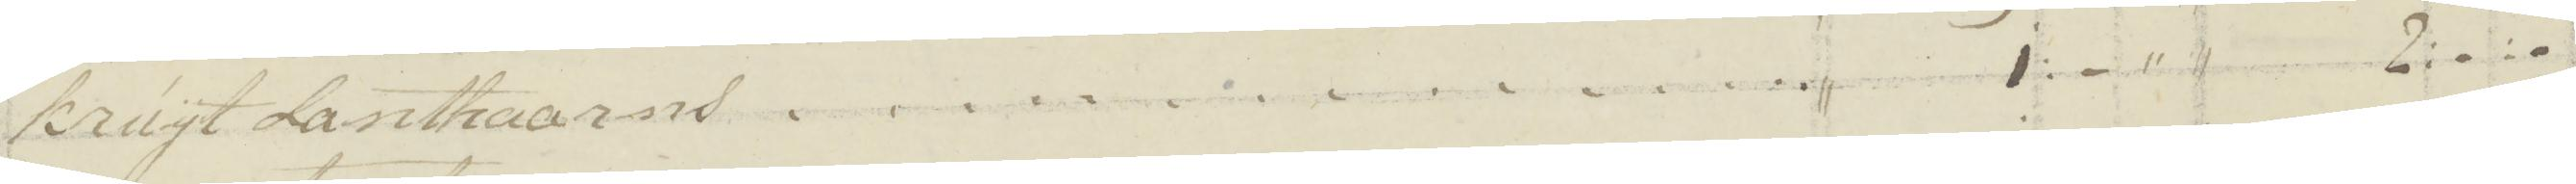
kruijt Lanthaarns - - - - - - - - - - - - - - - „ 1: -„ „ 2: - : -
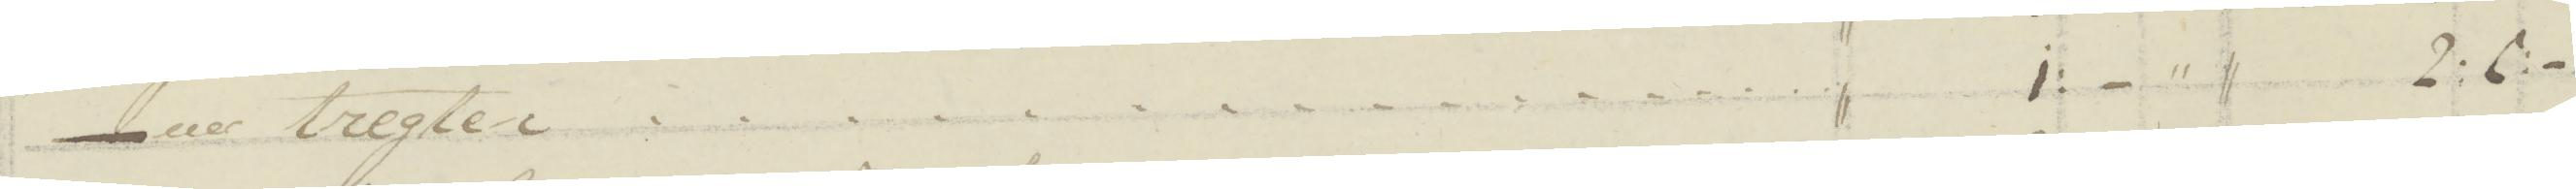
_o tregter - - - - - - - - - - - - - - - - „ 1: - „ „ 2: 5: -
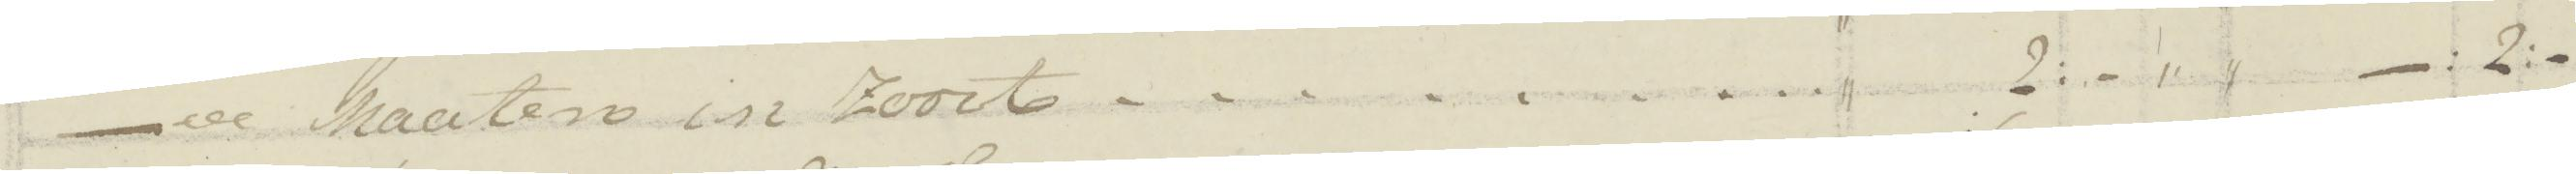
_o Maaten in zoort - - - - - - - - - „ 2: - „ „ —: 2: -
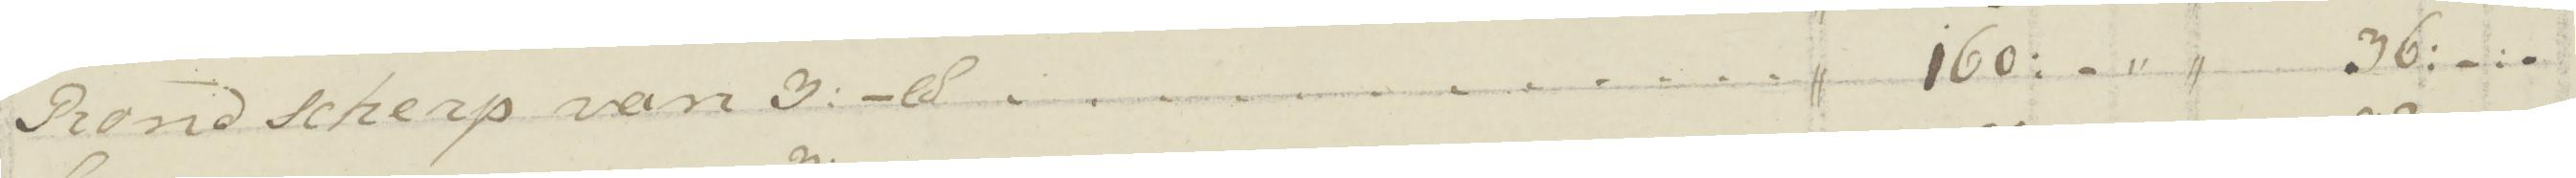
Rond scherp van 3:—lb - - - - - - - - - - - - „ 160: -„ „ 36: - : -
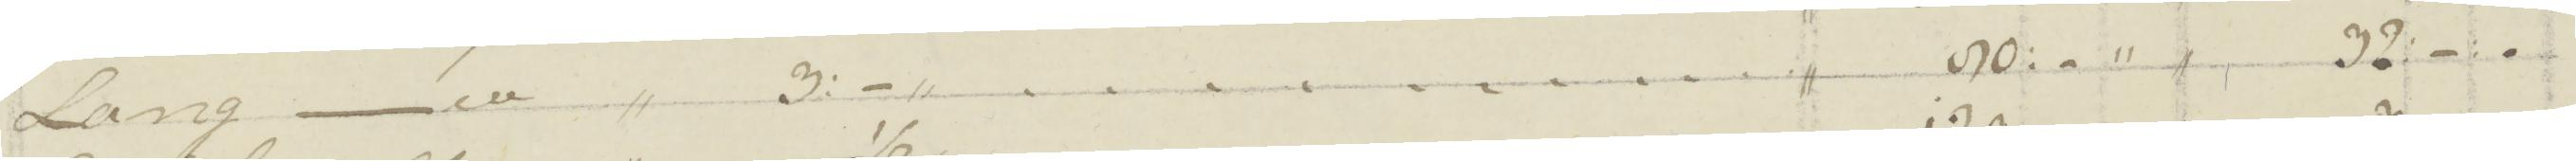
Lang _o „ 3:—„ - - - - - - - - - - „ 80: - „ „ 32: - : -
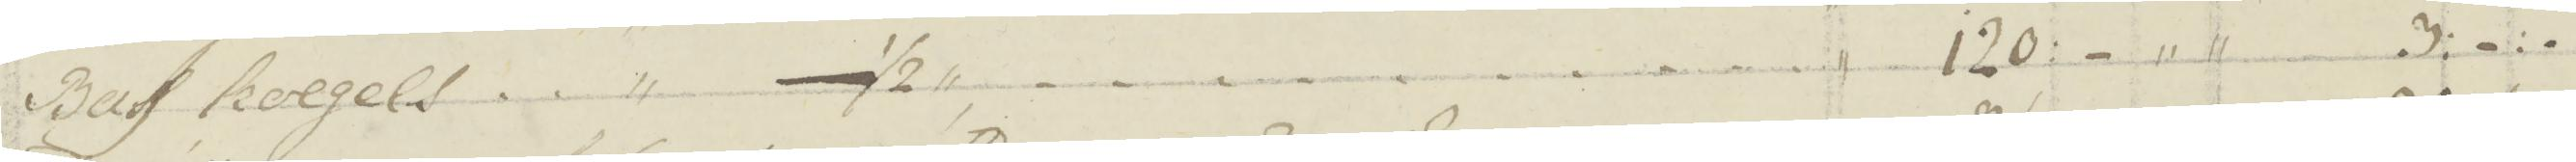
Bass koegels . . „ —½ „ - - - - - - - - - - 120: -„ „ 3: - : -
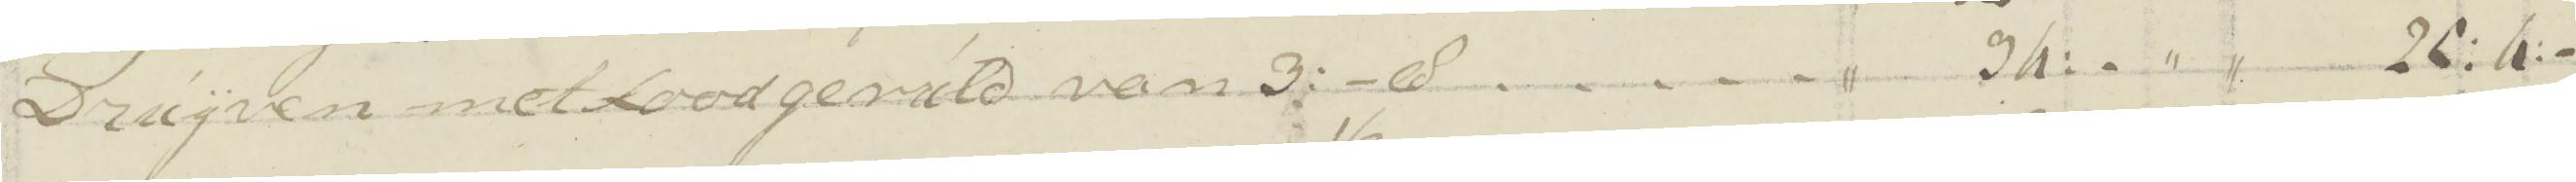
Druijven met Lood gevuld van 3:—lb - - - - - „ 34: -„ „ 25: 4: -
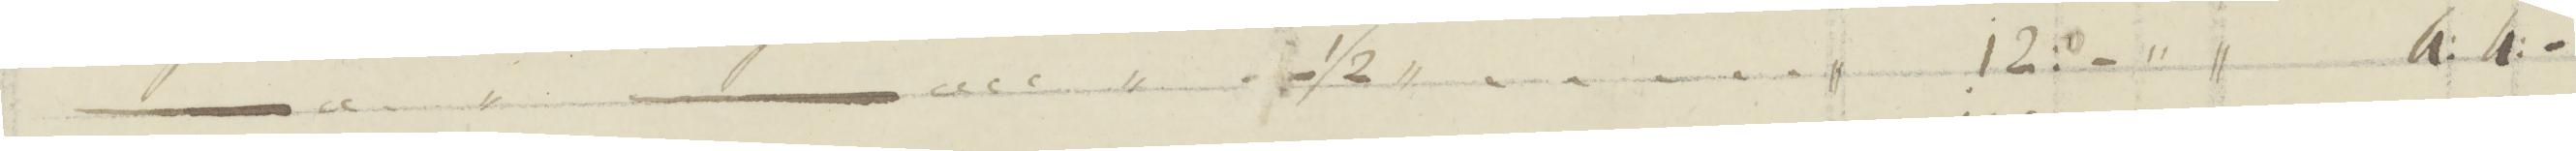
_o „ _o „ - -½„ - - - - - „ 12: - „ „ 4: 4: -
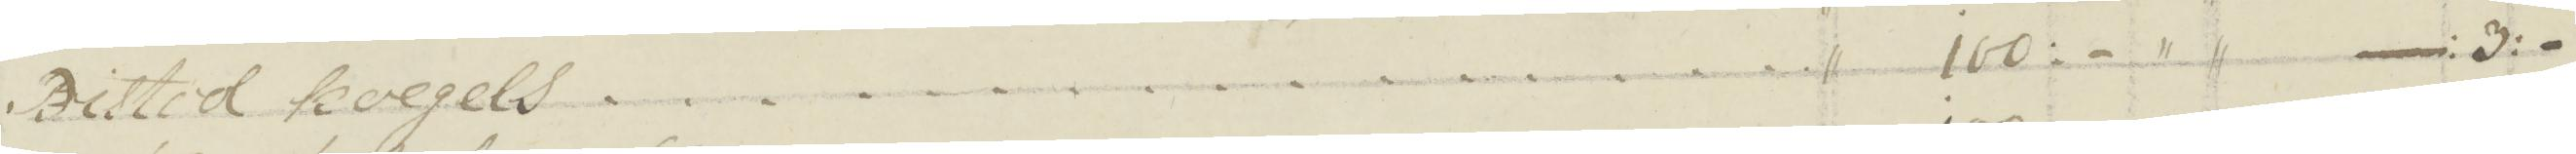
Pistool koegels - - - - - - - - - - - - - - - - „ 100: - „ „ —: 3: -
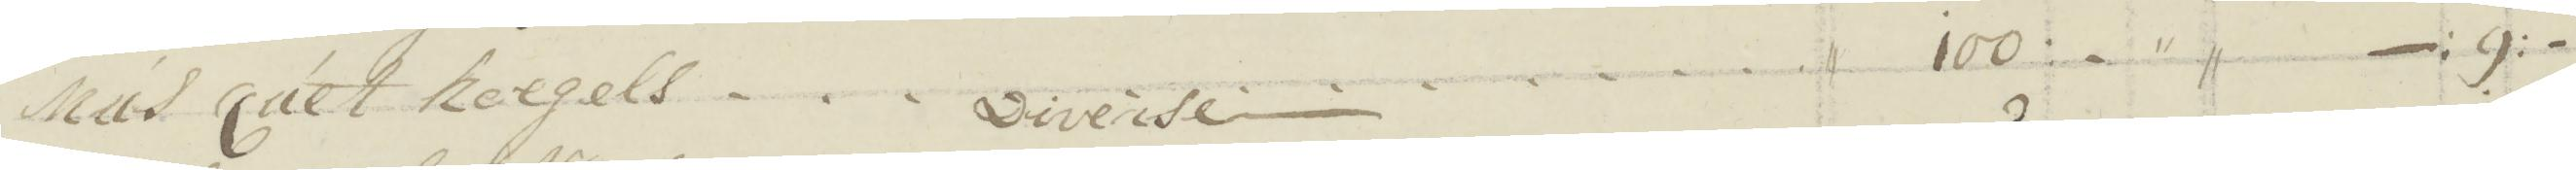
Mus quet koegels - - - - - - - - - - - - - „ 100: - „ „ —: 9: -
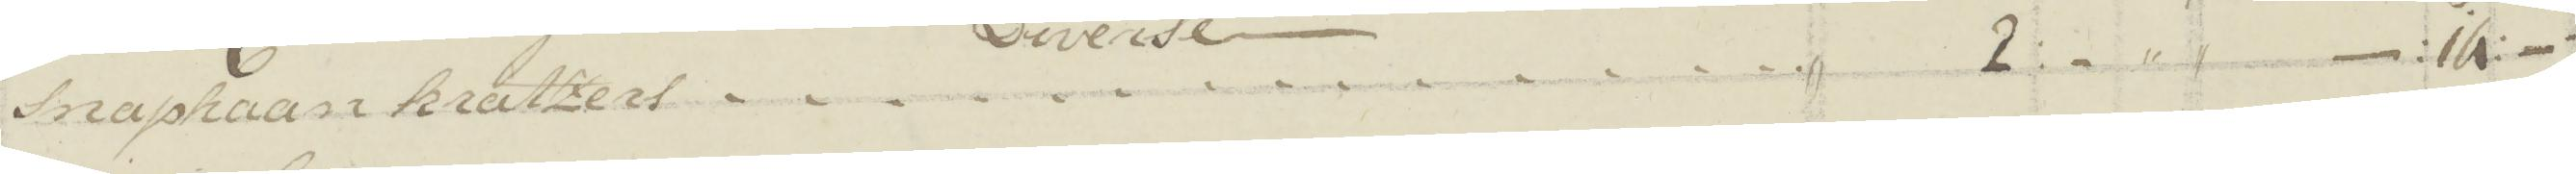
snaphaan kratzers - - - - - - - - - - - - - - „ 2: - „ „ —:14: -
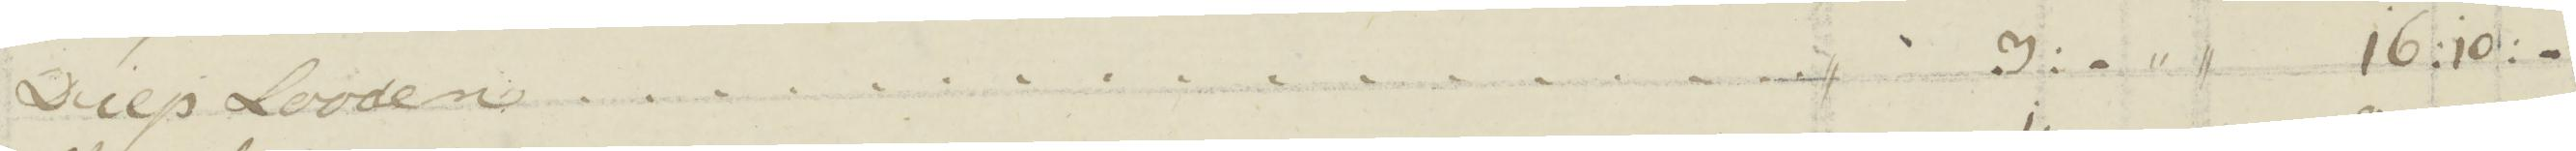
Diep Looden - - - - - - - - - - - - - - - - „ 3: - „ „ 16:10: -
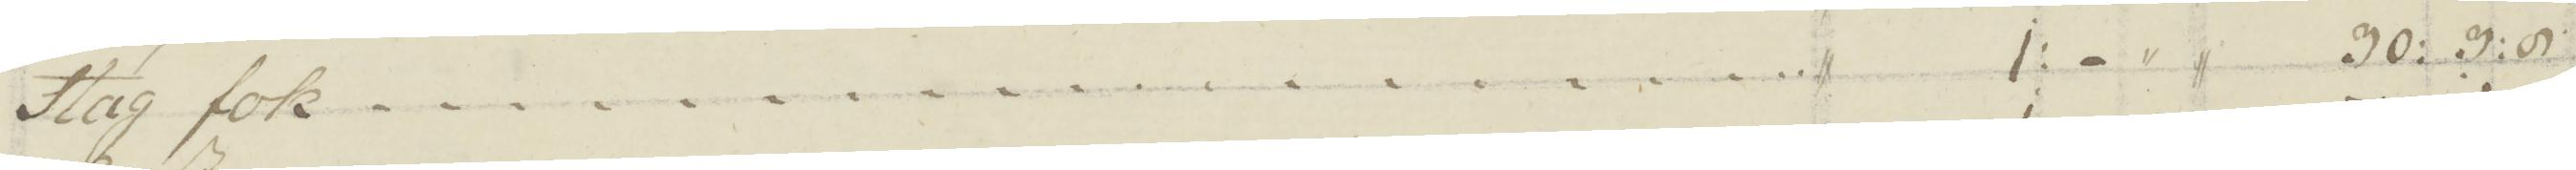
stag fok - - - - - - - - - - - - - - - - - - - - „ 1: - „ „ 30: 3:8
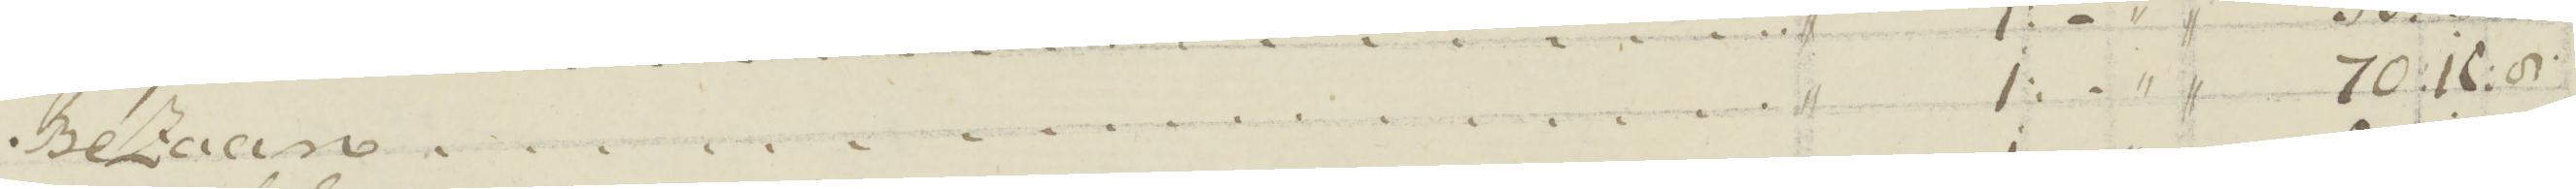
Bezaan - - - - - - - - - - - - - - - - - - „ 1: - „ „ 70:15:8
